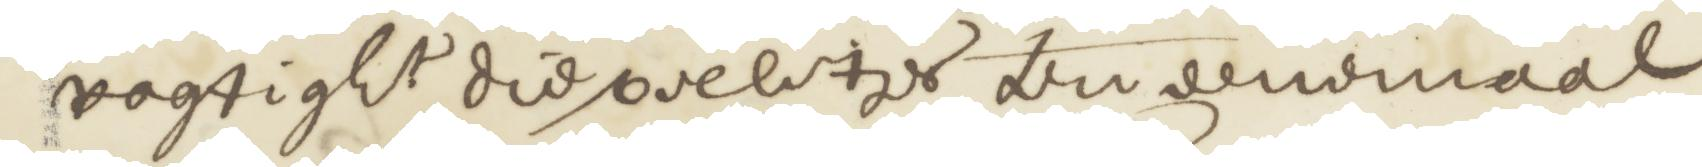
vogtight die velletjes ten eenemaal
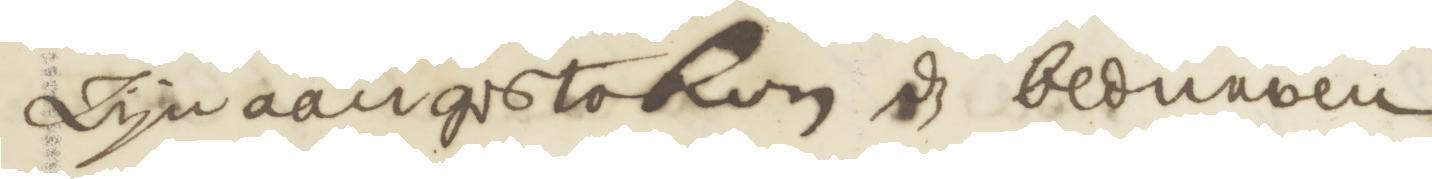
zijn aan gestoken en bedurven
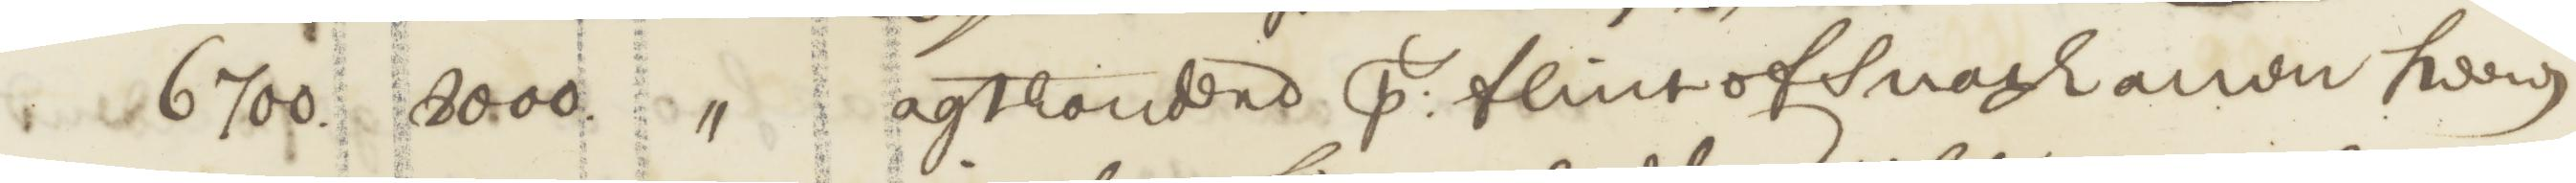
6700. 8000. „ agthonderd p:s flint of snaphanen steenen
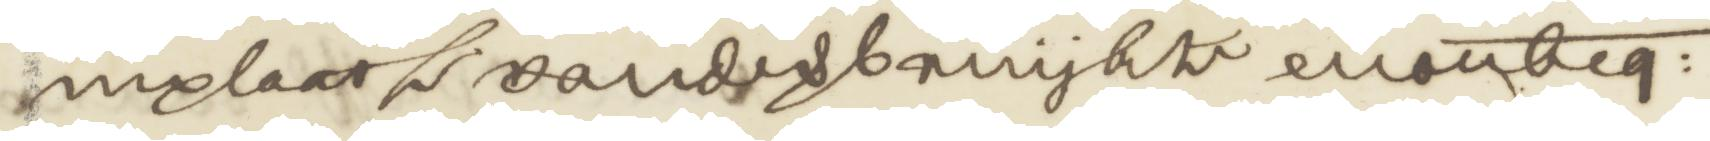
inplaatse van de verbruijkte en onbeq:
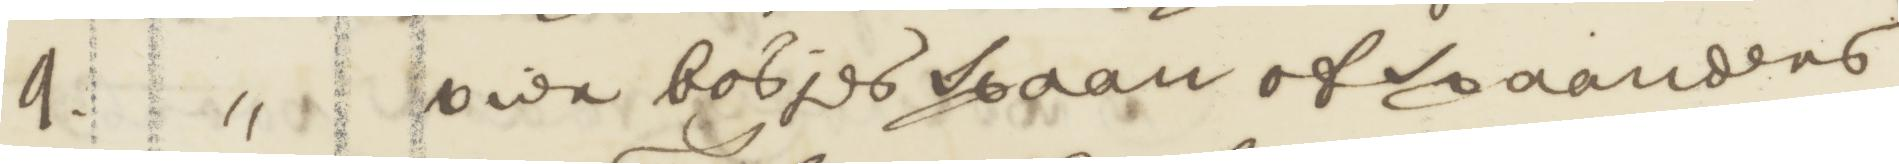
4. „ vier bosjes verpaan of spaanders
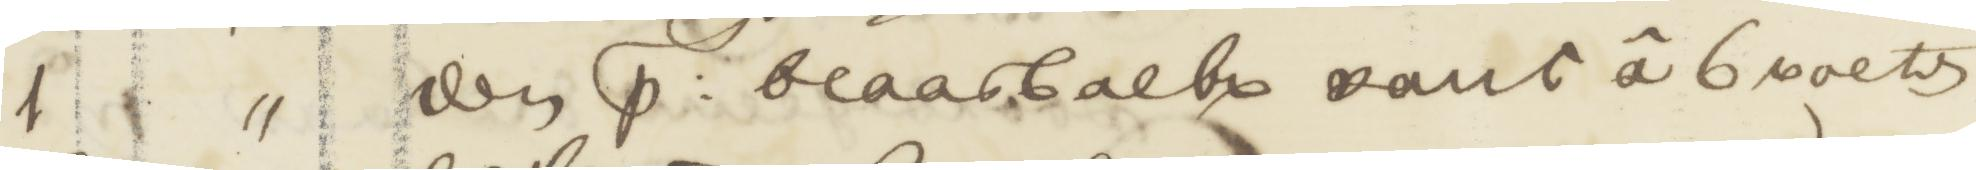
1 „ den p:s blaasbalk van 5 â 6 voeten
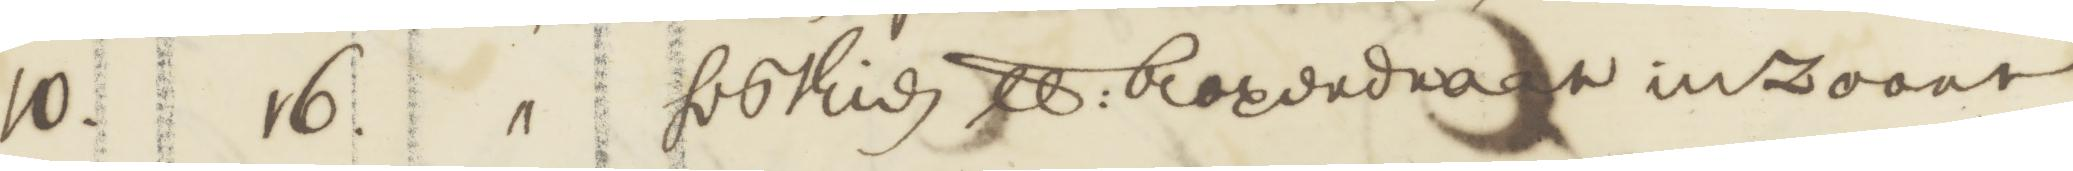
10. 16. „ sesthien lb. koperdraat in zoort
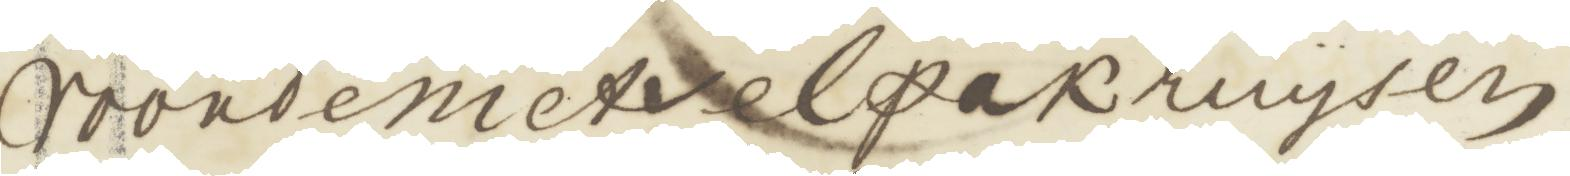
voorde metsel pakhuijsen
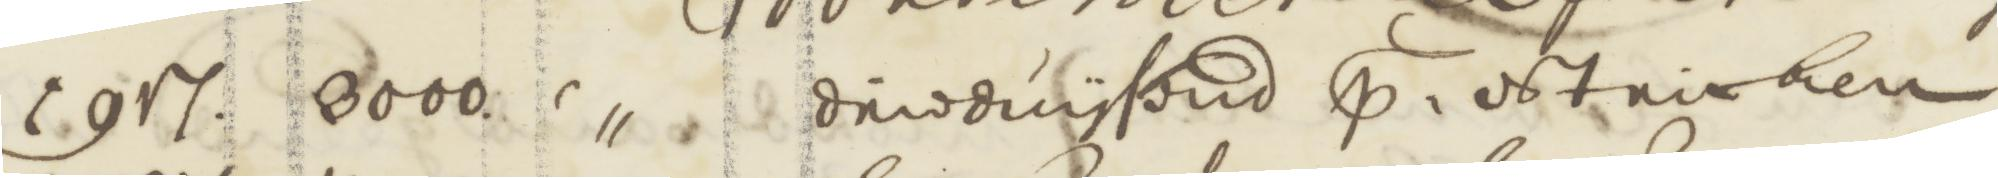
5917. 3000. „ drieduijsend p.s estricken
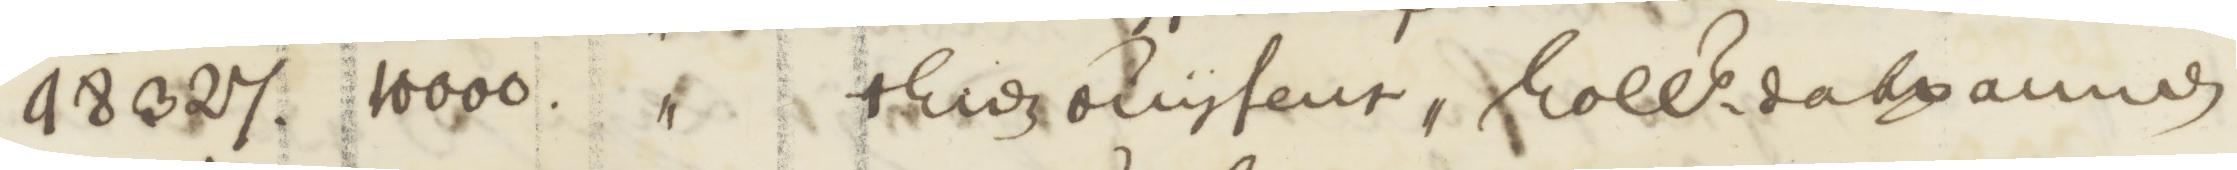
48327. 10000. „ thien duijsent „ holl:s dakpannen
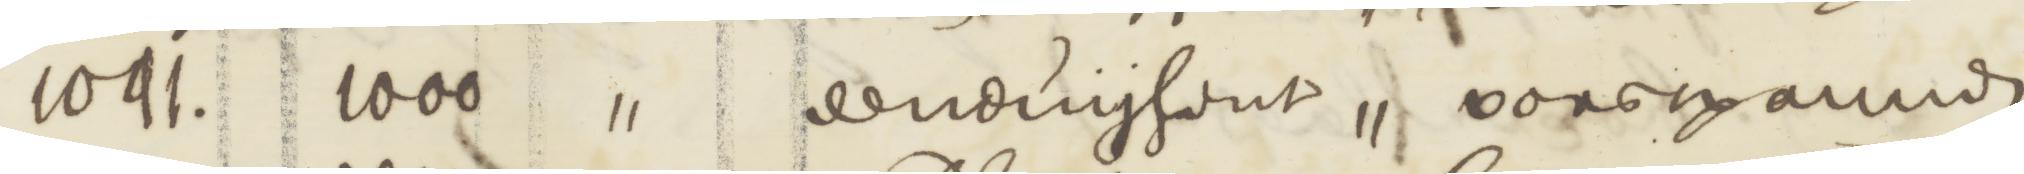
1041. 1000 „ eenduijsent „ vorstpannen
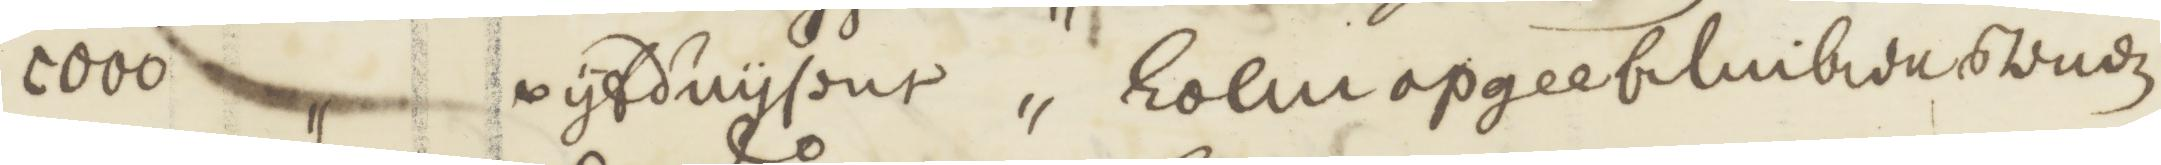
5000 „ vijfduijsent „ holm op gee klinker stenen
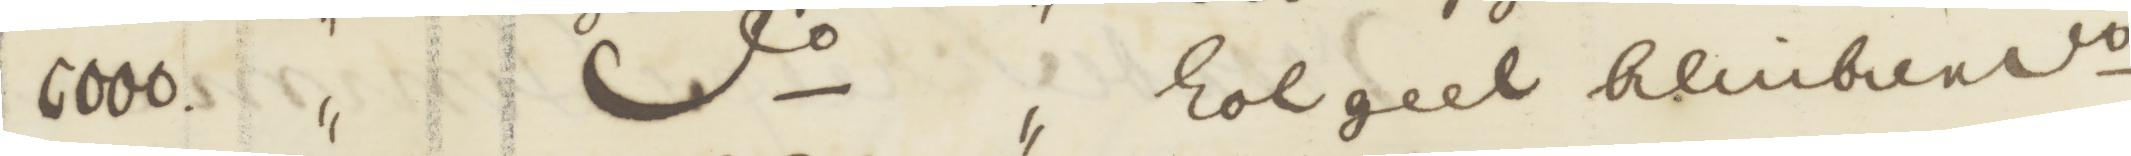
5000. „ d_o „ hol geel klinker d_o
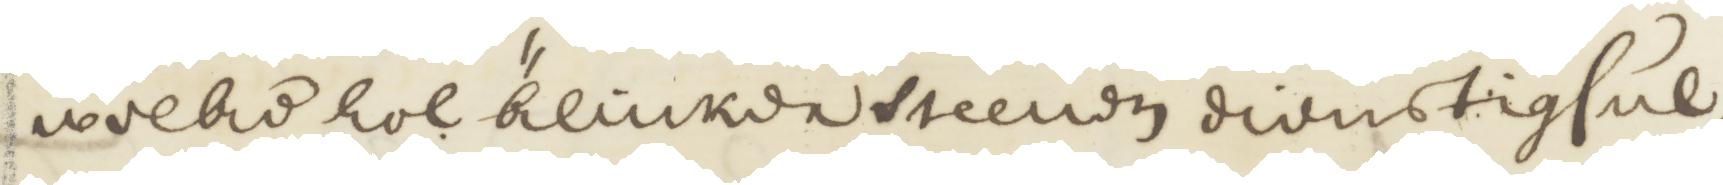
welke hol klinker steenen dienstig sul„
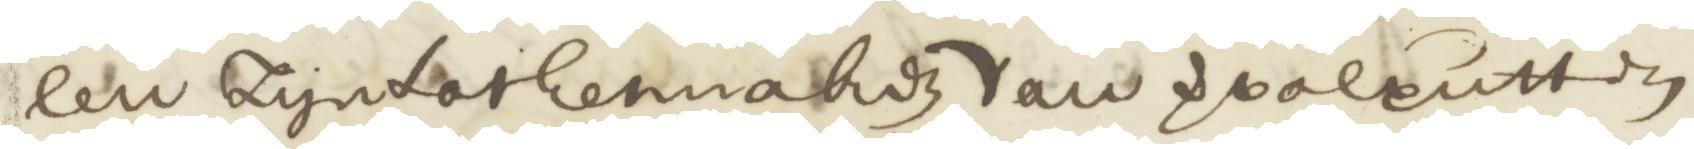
len zijn tot het maken van vervalputten
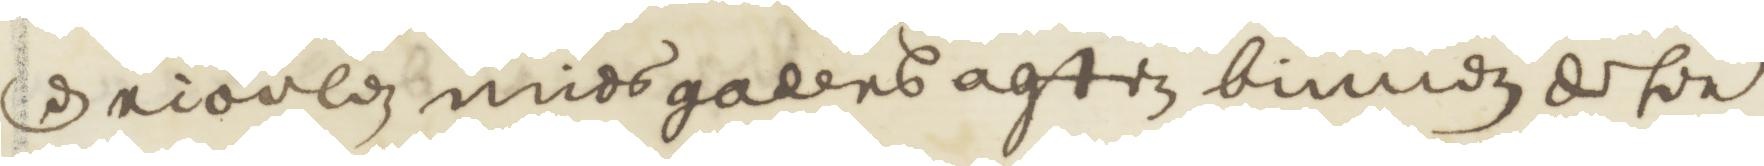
ende rioelen midsgaders agten binnen deser
